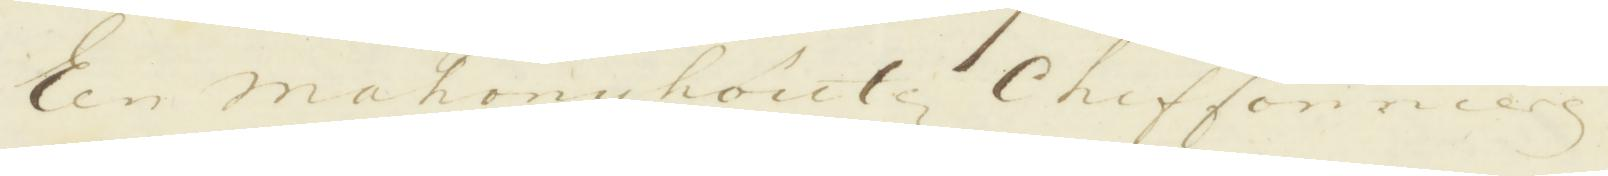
Een mahonyhouten Chiffonnieren
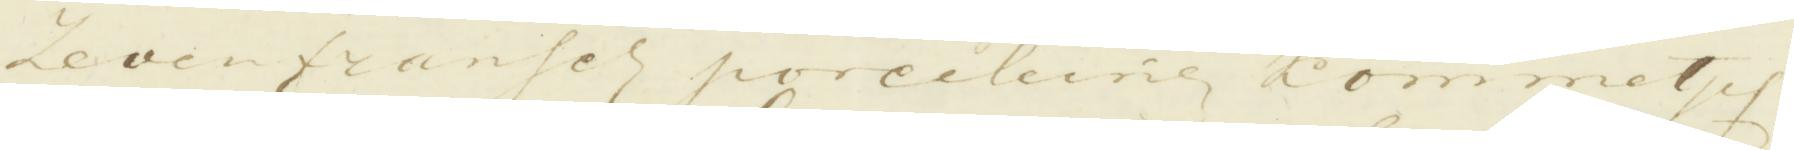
Zeven fransch porceleinen kommetjes
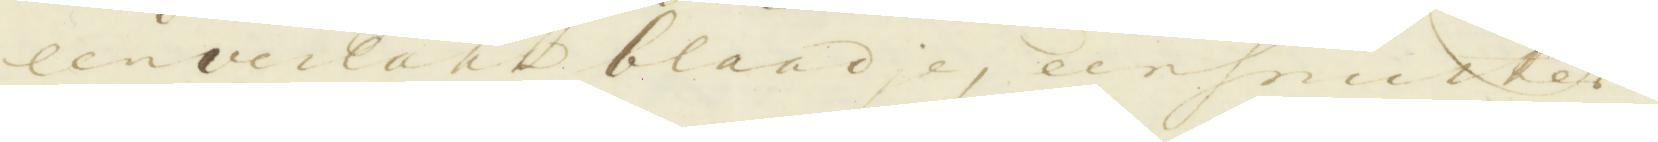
een verlakt blaadje, een snuiter
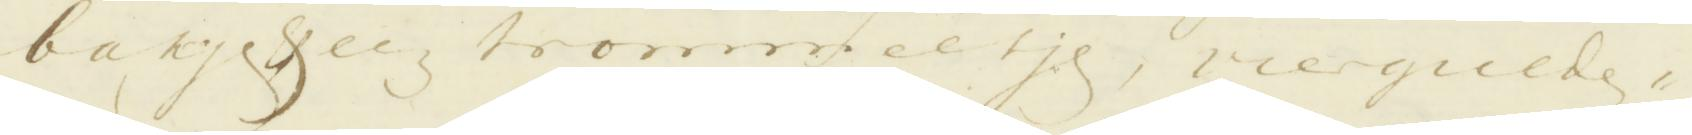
bakjes een trommeltje; vier gulden „
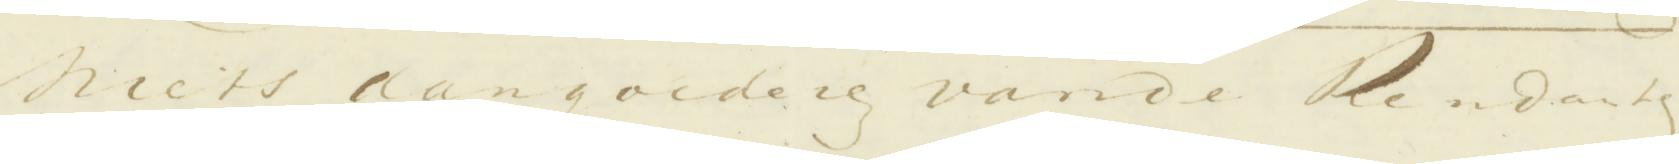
niets dan goederen van de Rendante
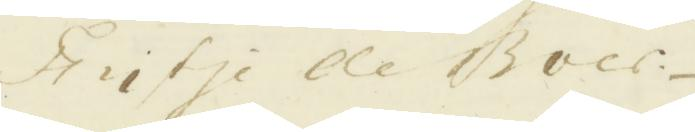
Fytje de Boer.
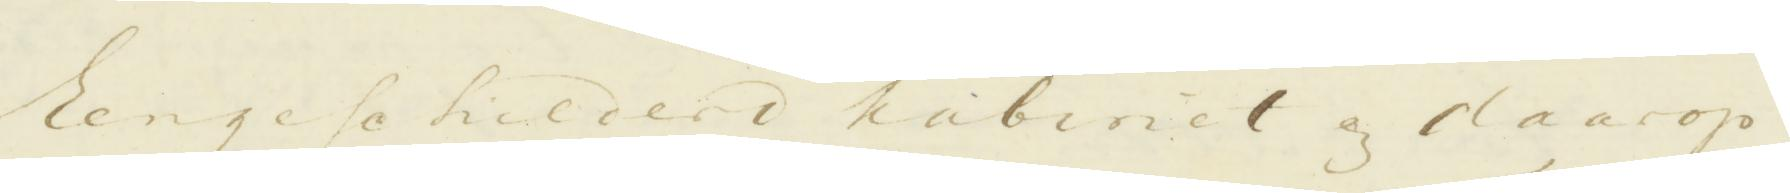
Een geschilderd kabinet en daarop
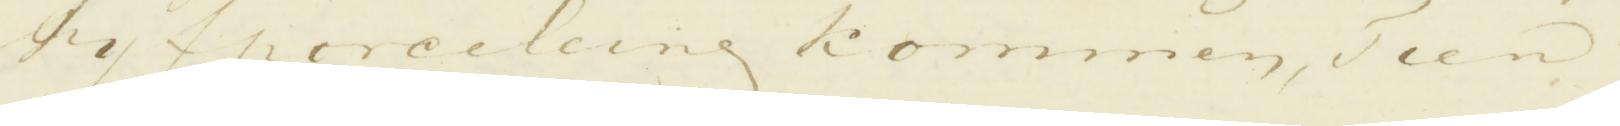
vyf porceleine kommen, Tien
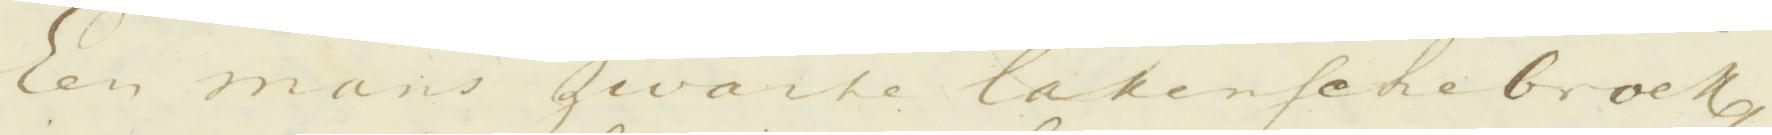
Een mans zwarte lakensche broek
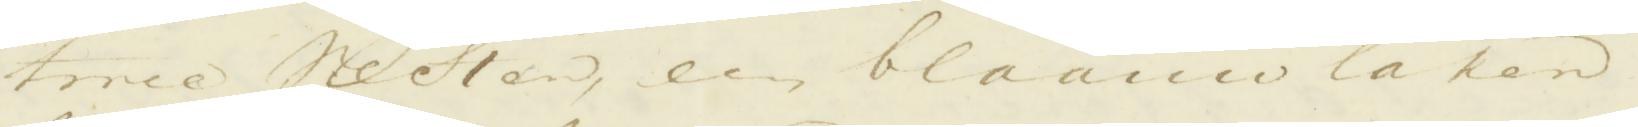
twee Vesten, een blaauwlaken
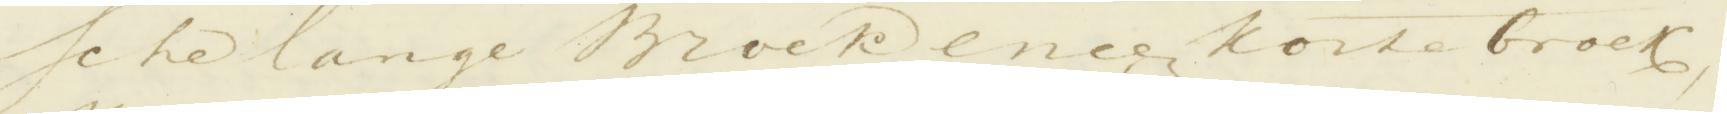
sche lange Broek en een korte broek,
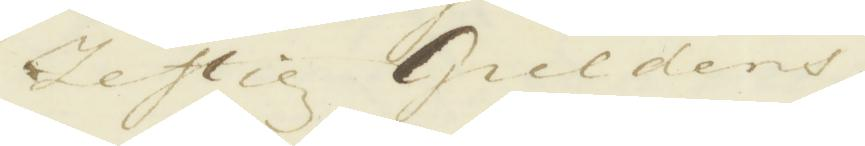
Zestig Guldens
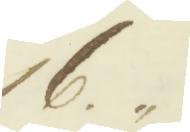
16.„
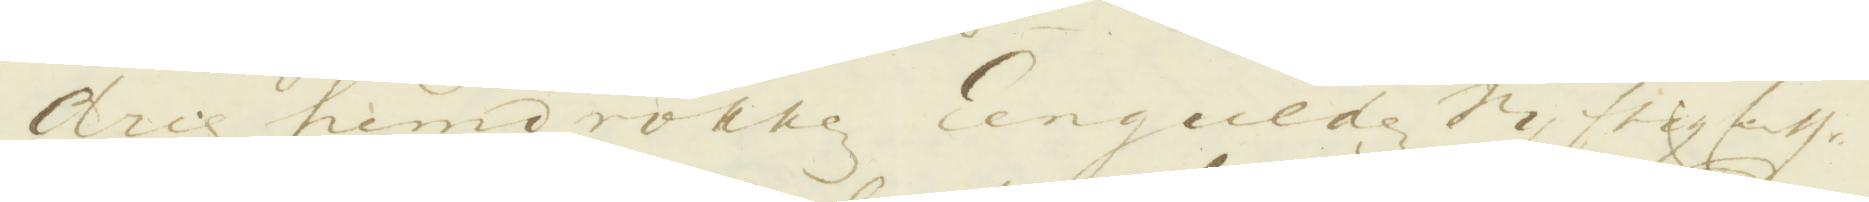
drie hemdrokken Een gulden Vyftig Cents„
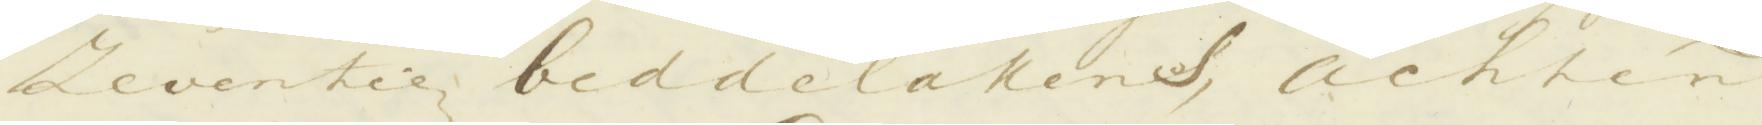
Zeventien beddelakens, achten
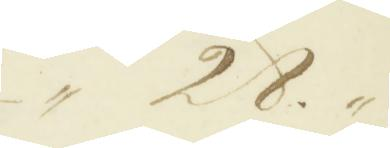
„ 28.„
